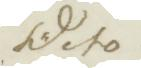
Dito . . . . . . . .
